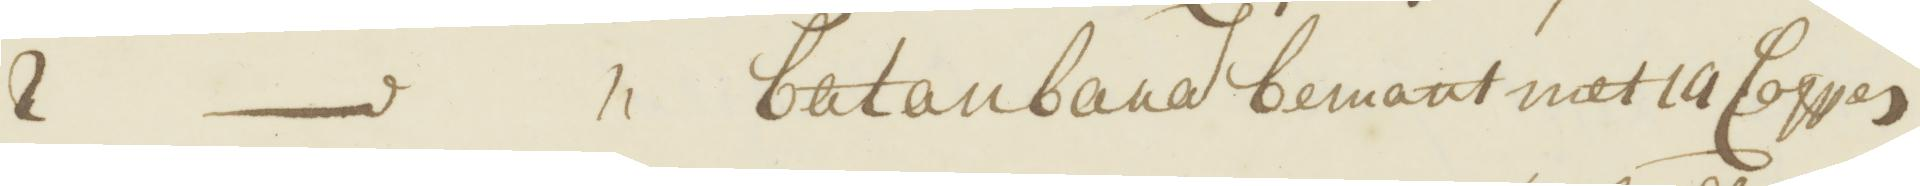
2 _o „ batanbara bemant met 14 Coppen
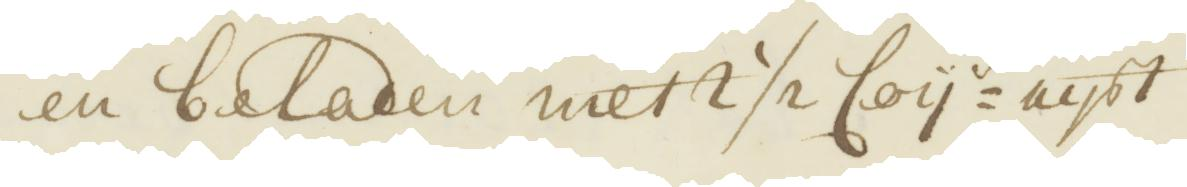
en beladen met 2½ coij=s rijst
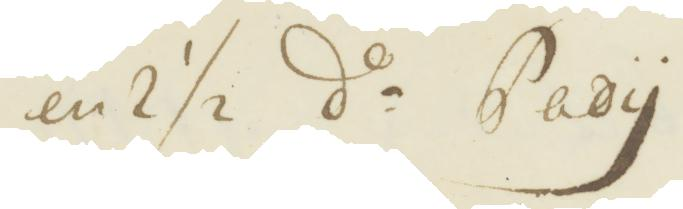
en 2½ d=o Padij
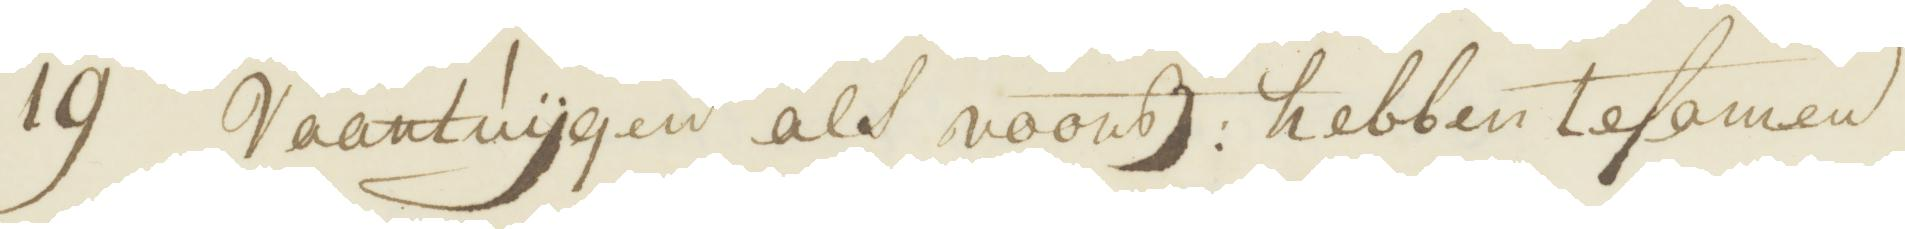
19 vaartuijgen als voorsz: hebben tesamen
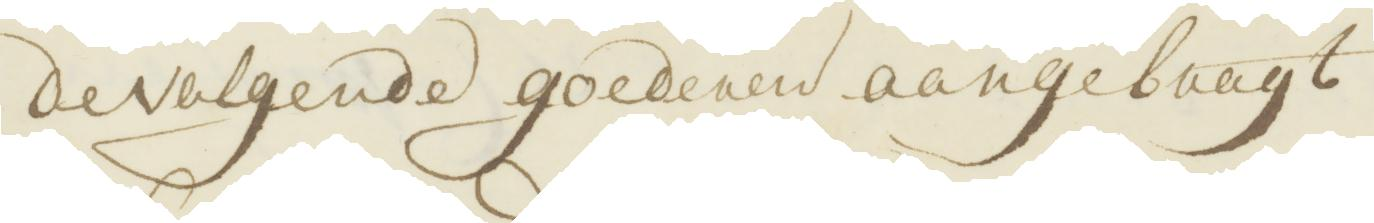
de volgende goederen aangebragt
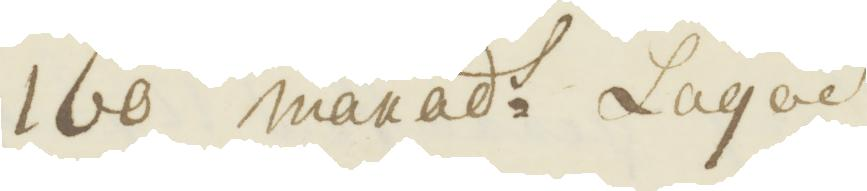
160 marad=s Zagoe
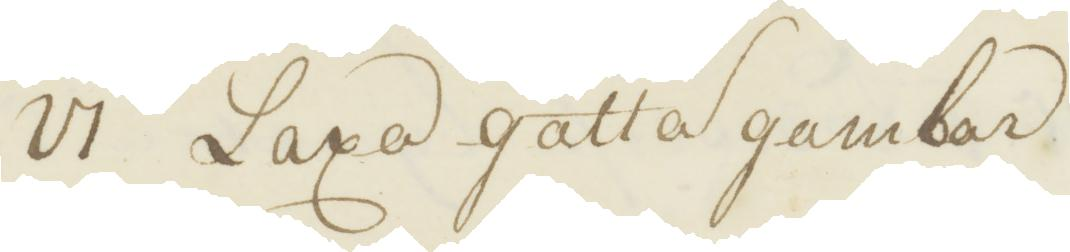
27 Laxa gatta gambar
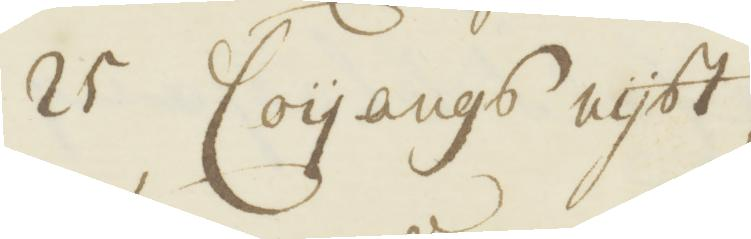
25 Coijangs rijst
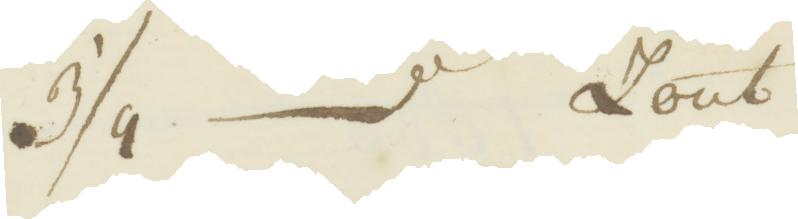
3¼ _o zout
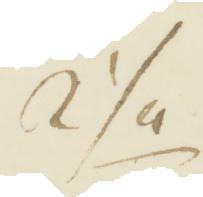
2¼
